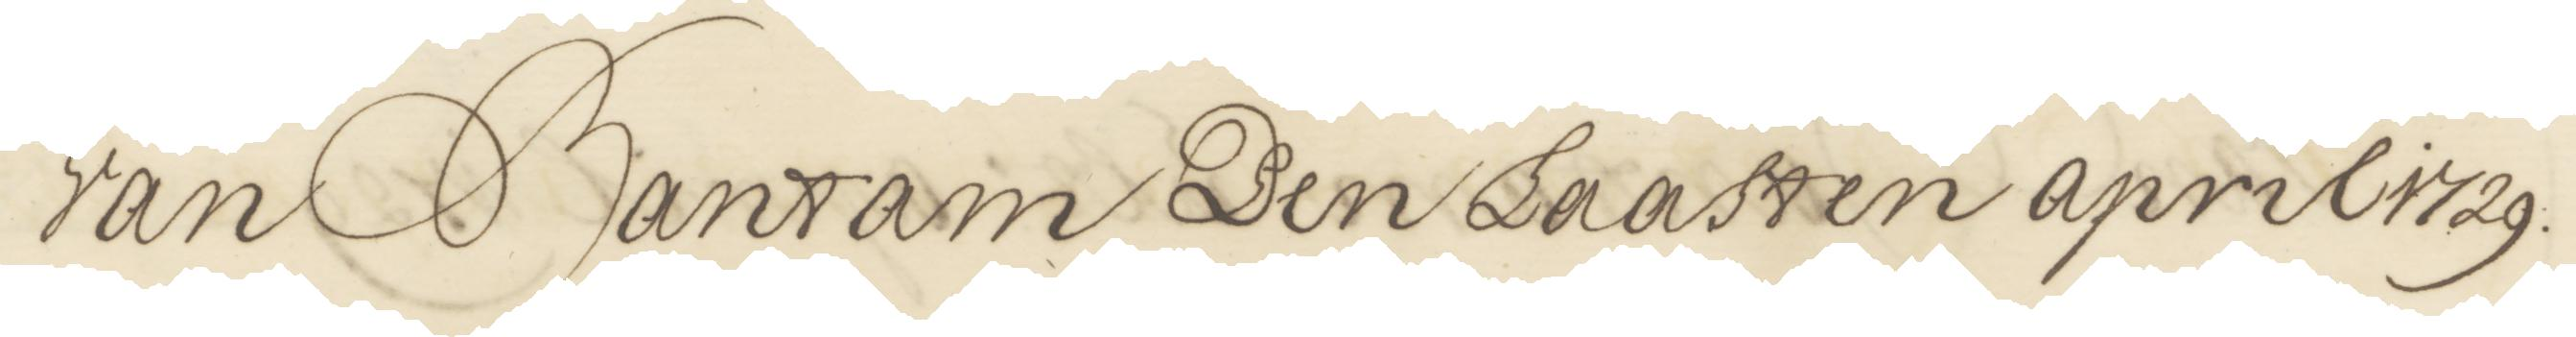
Van Bantam Den Laasten april 1729.
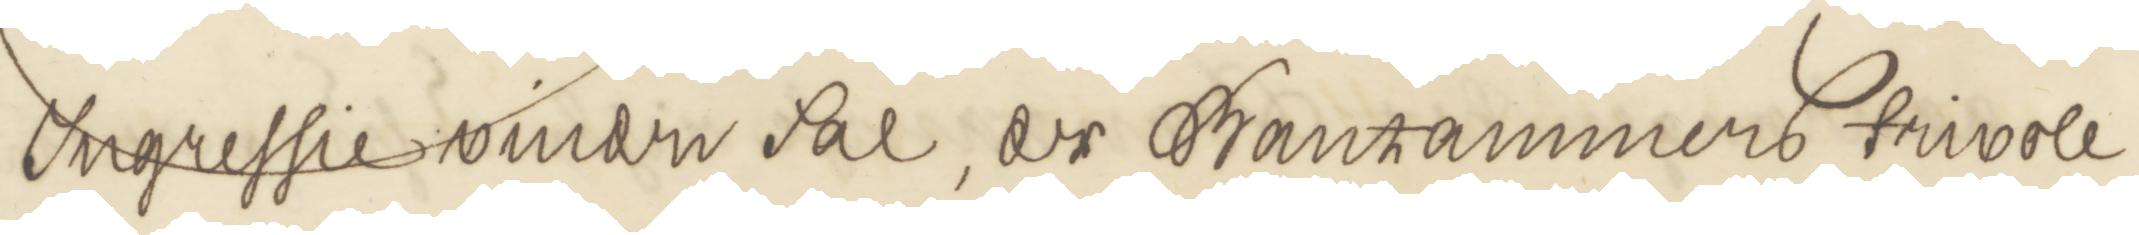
Ingressie vinden sal, der Bantammers frivole
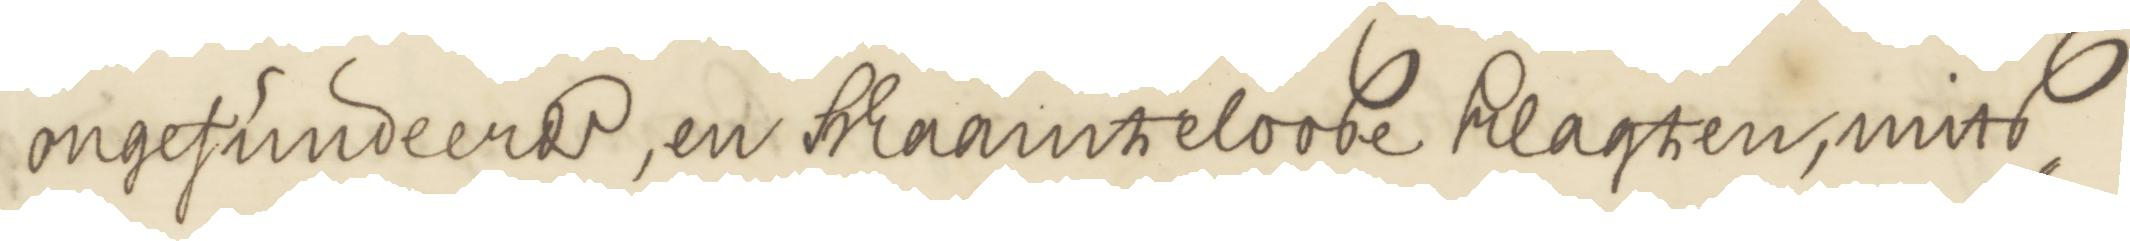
ongefundeerde, en schaamteloose klagten, mits„
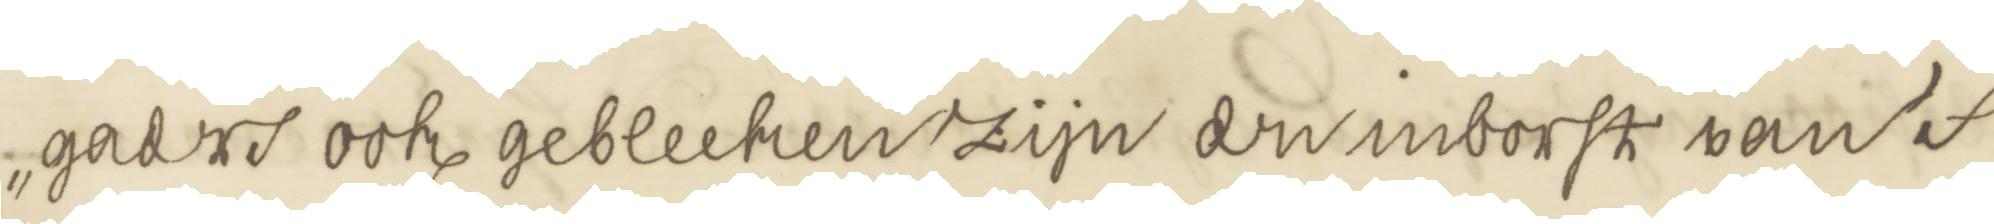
„gaders ook gebleeken zijn den inborst van 's
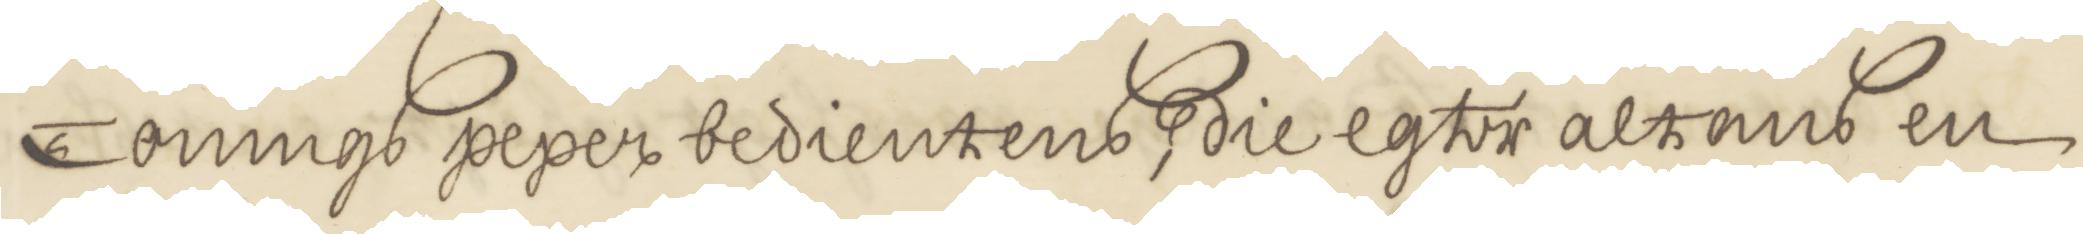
conings peper bedientens, die egter altans en
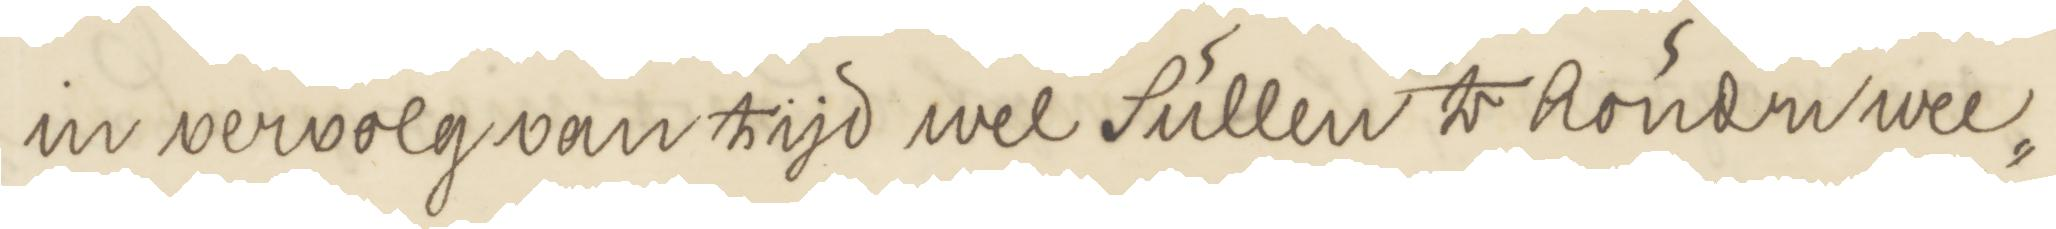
in vervolg van tijd wel sullen te houden wee„
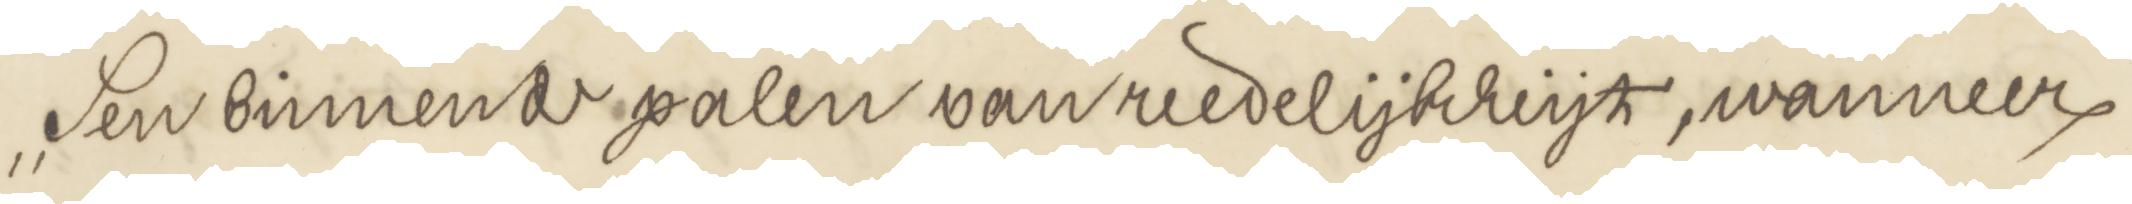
„sen binnen de palen van reedelijkheijt, wanneer
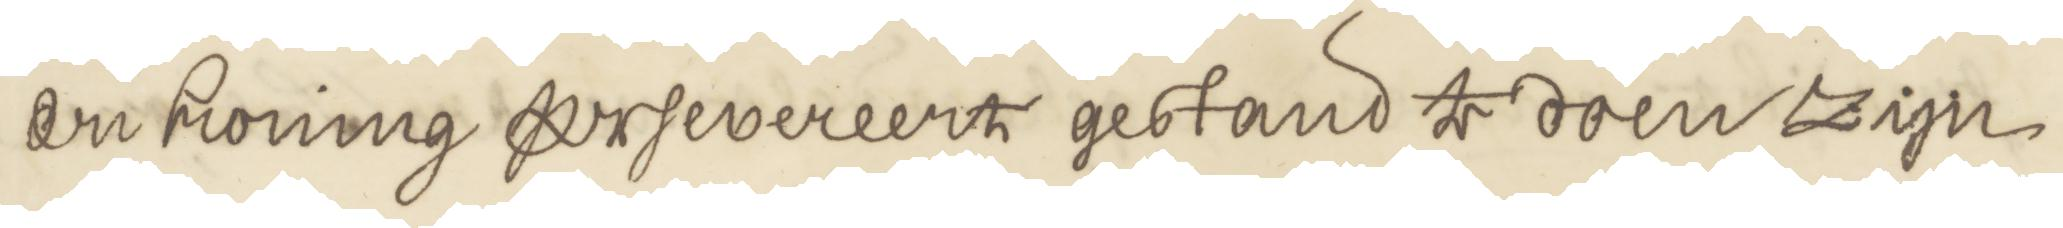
den koning persevereert gestand te doen zijn
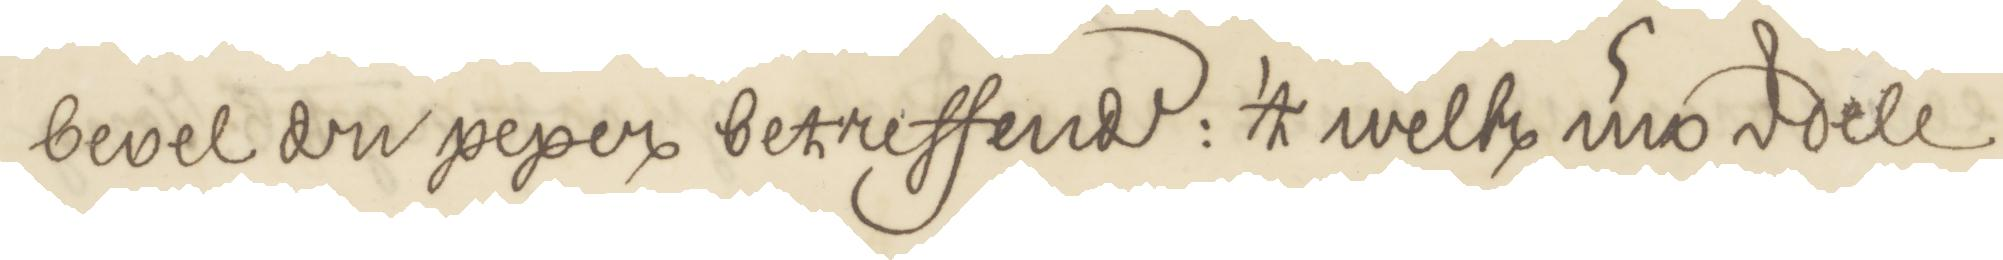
bevel den peper betreffende: 't welk uw Edele
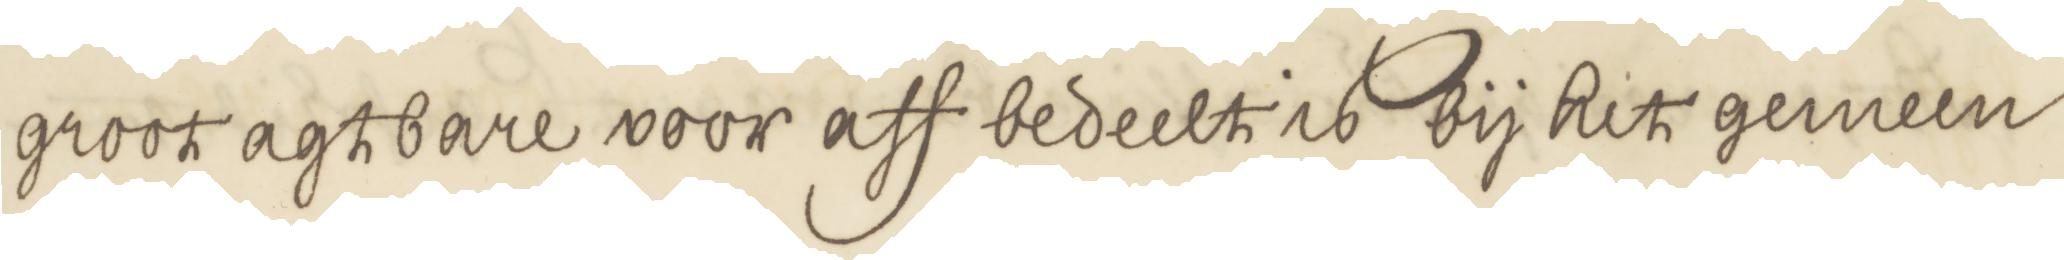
groot agtbare voor aff bedeelt is bij hit gemeen
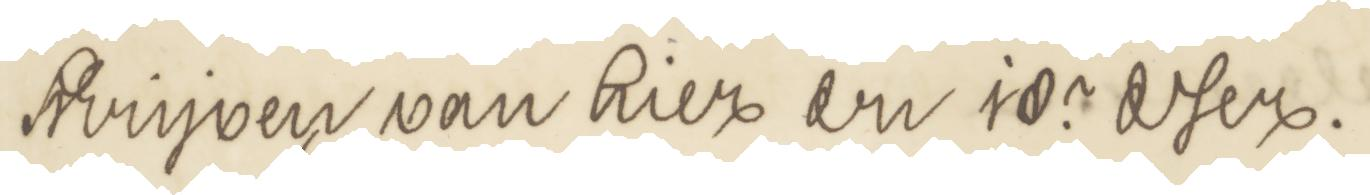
schrijven van hier den 18:e deser.
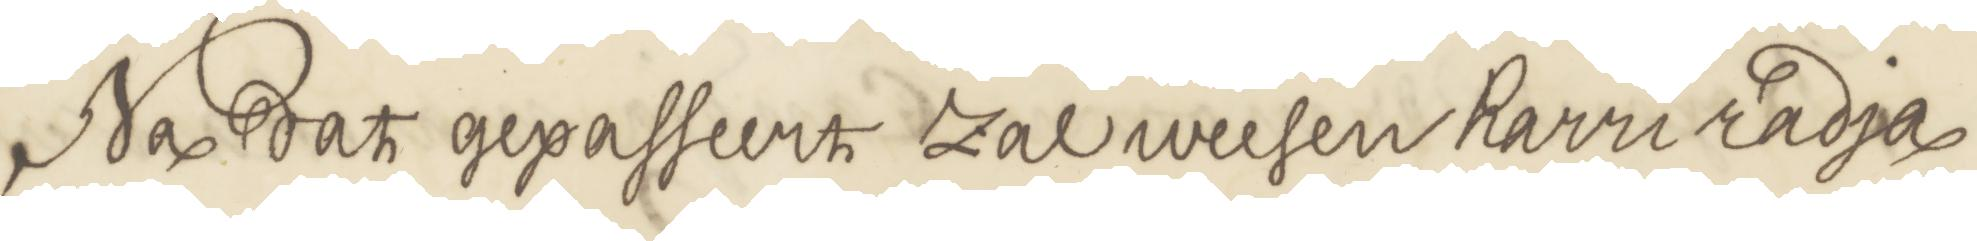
Na dat gepasseert zal weesen harri radja
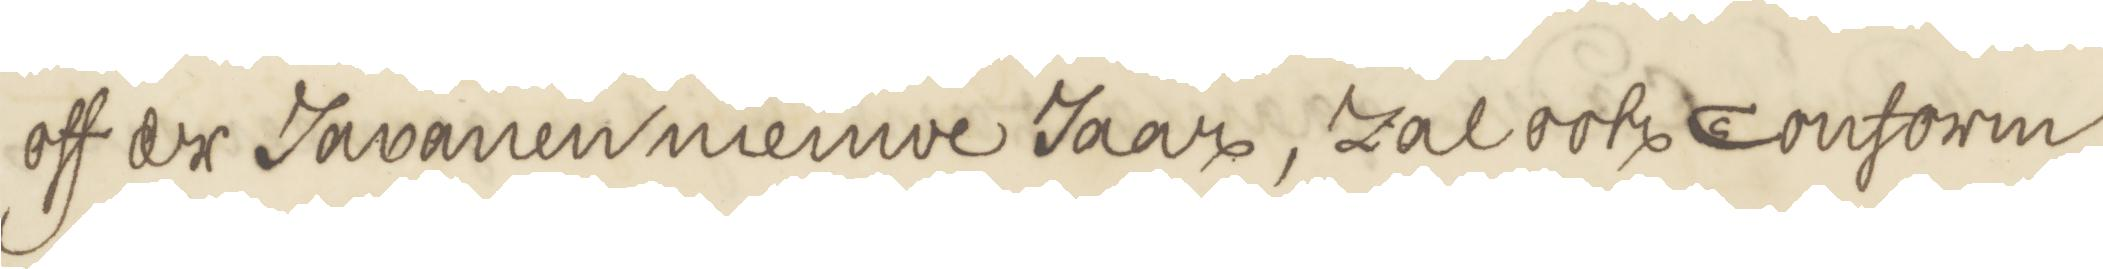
off der Javanen nieuwe Iaar, zal ook conform
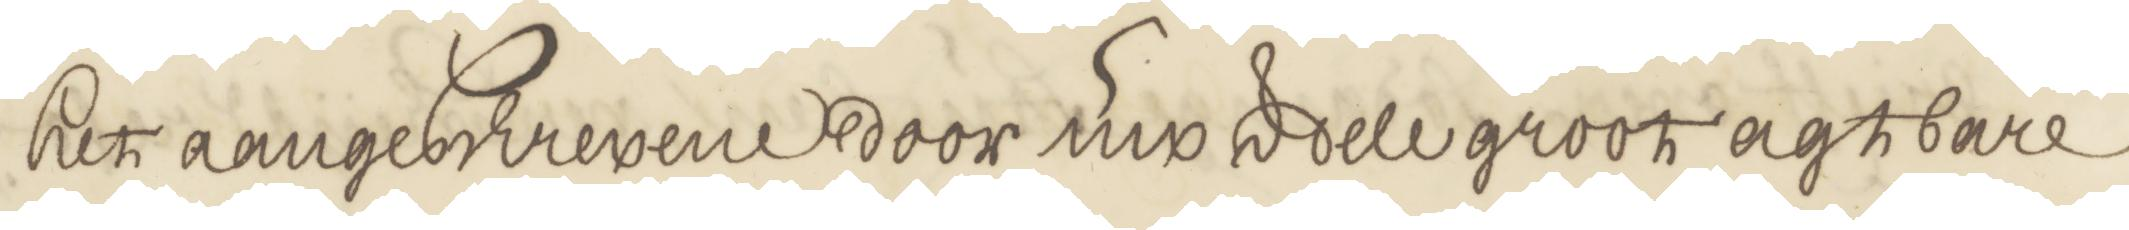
het aangeschrevene door uw Edele groot agtbare
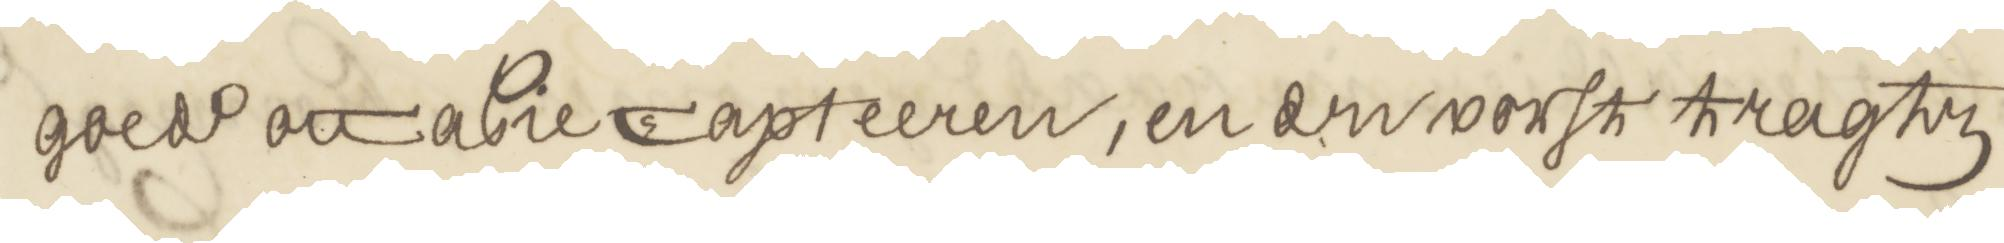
goede occasie capteeren, en den vorst tragten
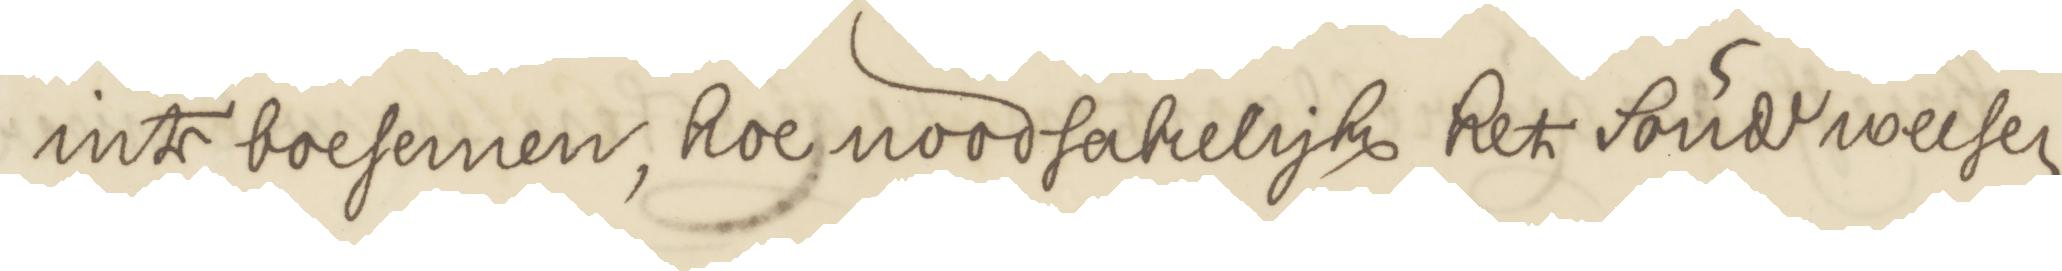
inte boesemen, hoe noodsakelijk het soude weesen
